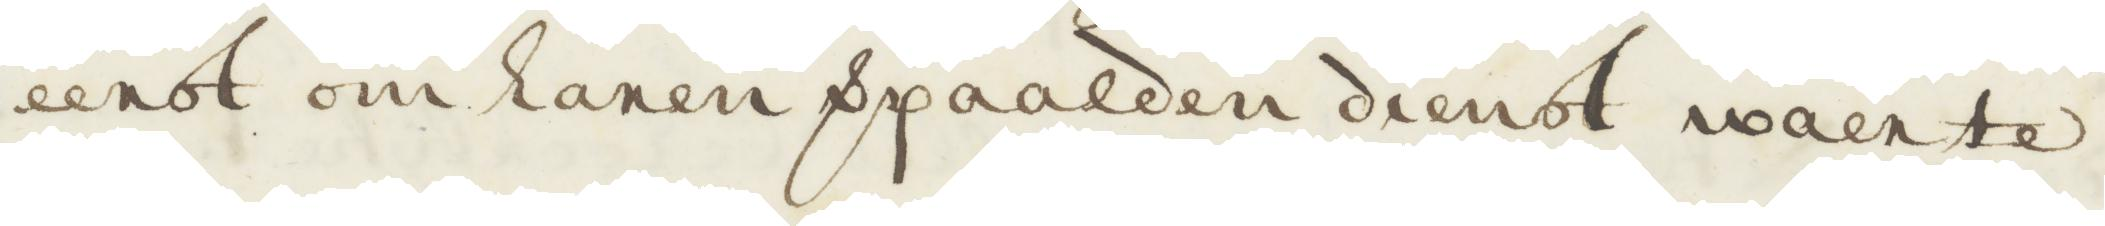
eerst om haren verpaalden dienst waer te
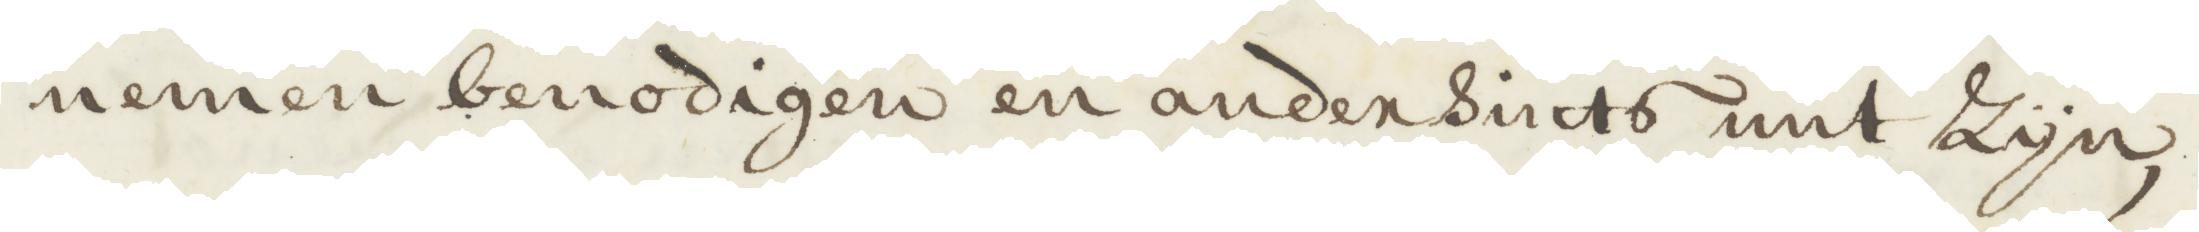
nemen benodigen en ander sints nut zijn,
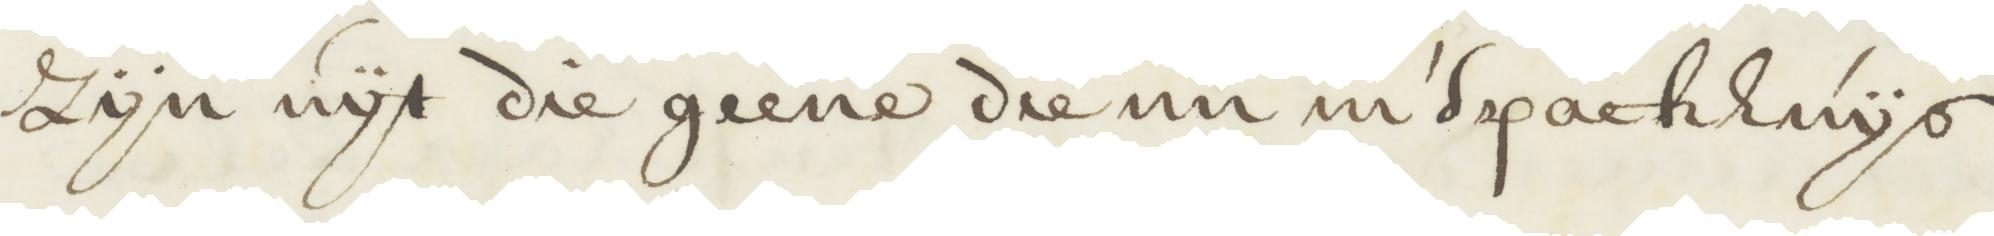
zijn uijt die geene die nu in ’t packhuijs
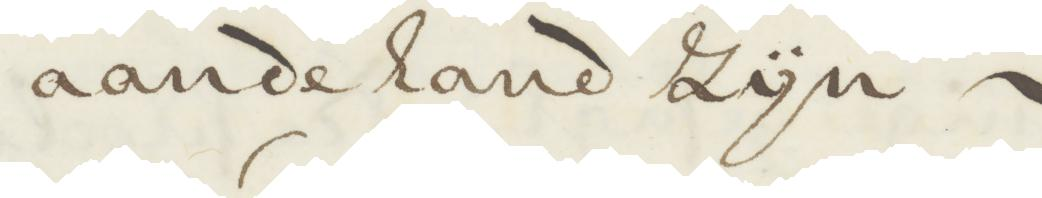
aande hand zijn
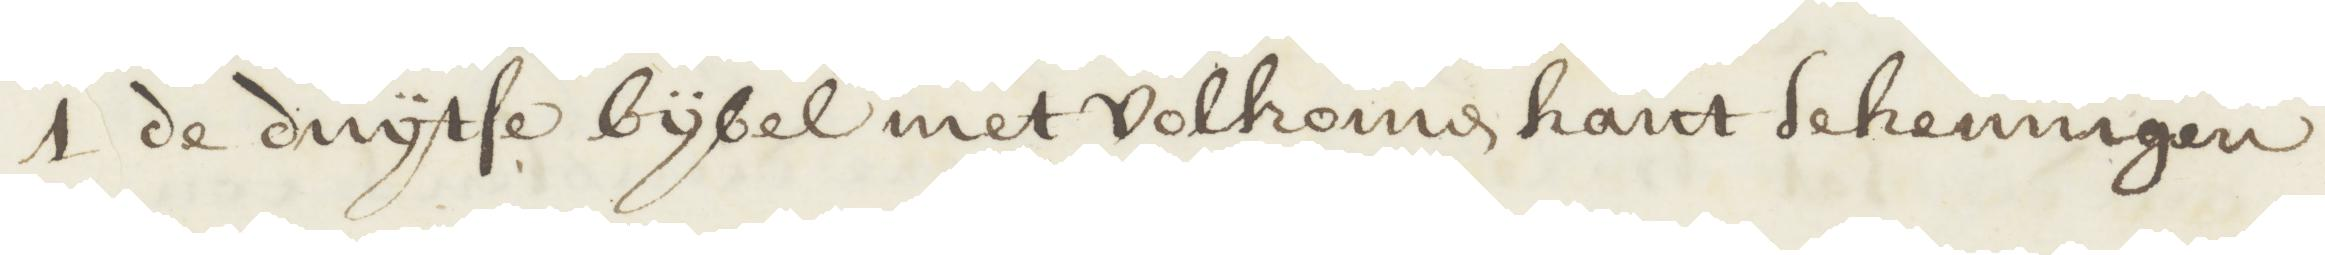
1 de duijtse bijbel met volkomen kant tekeningen
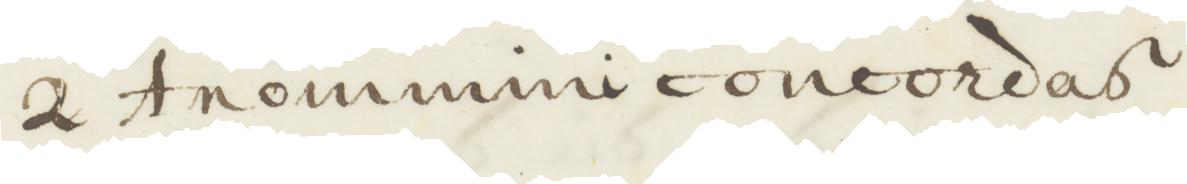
2 trommini concordas
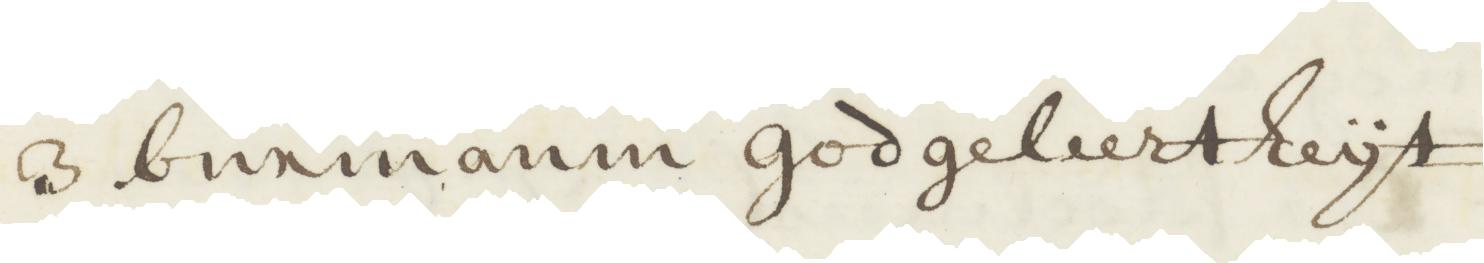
3 burmanni godgeleertheijt
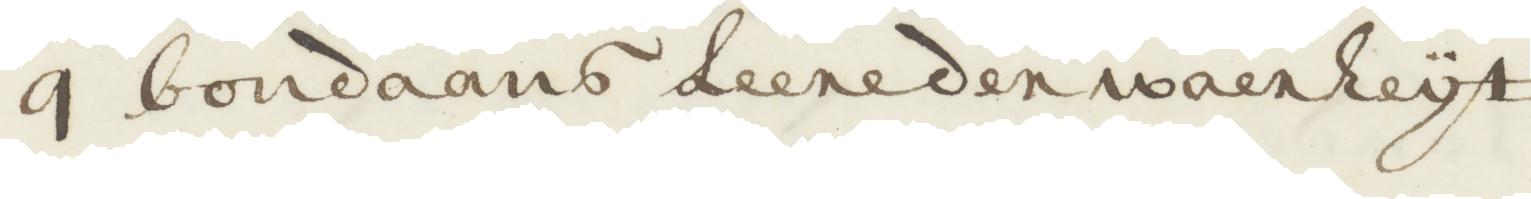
4 bondaans Leereder waerheijt
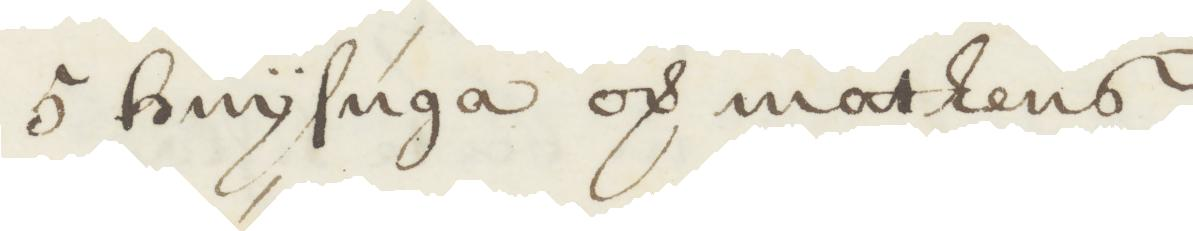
5 huijsuga over matheus
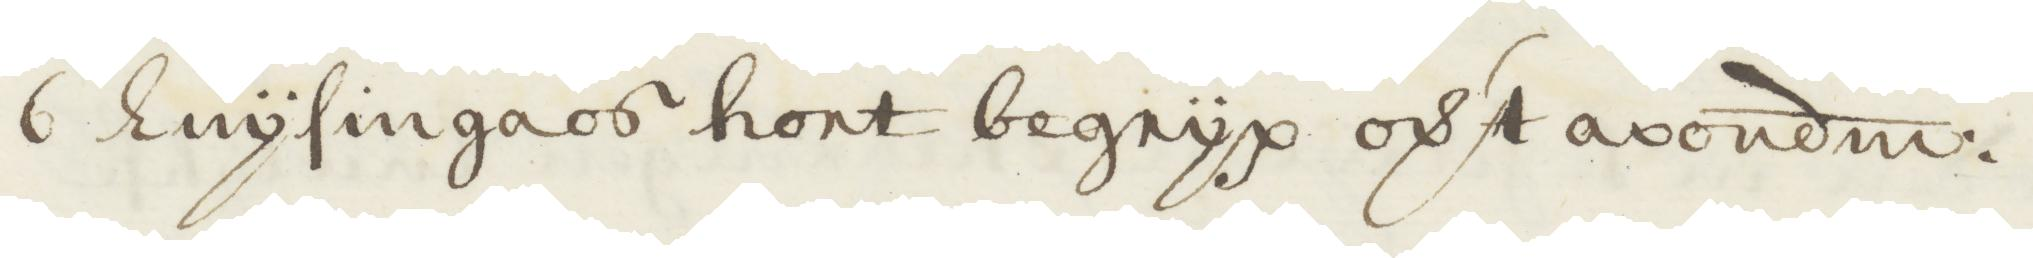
6 huijsingaos kort begrijp over’t avondm:
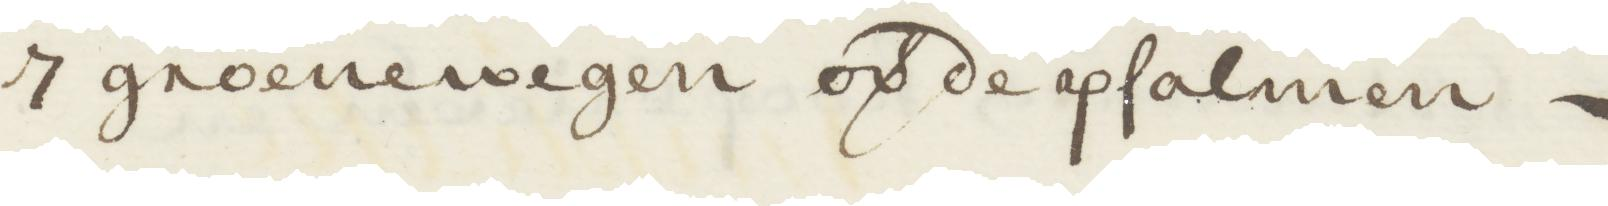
7 groenewegen over de psalmen
